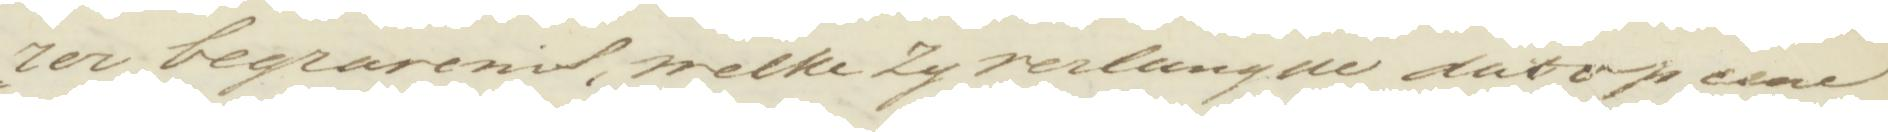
rer begravenis, welke zy verlang de dat op eene
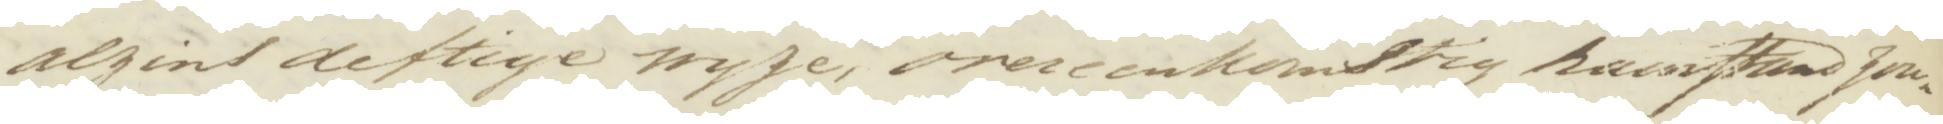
alzins deftige wyze, overeenkomstig haar stand Zou„
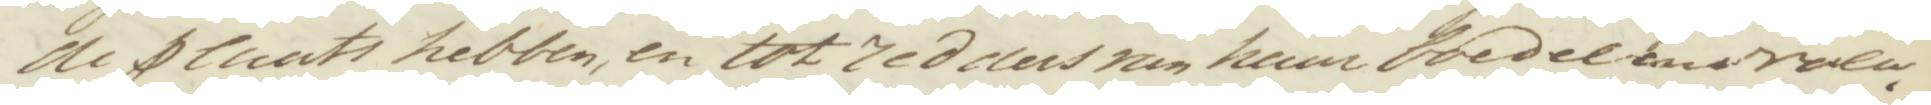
de plaats hebben, en tot redders van haar boedel en Nala„
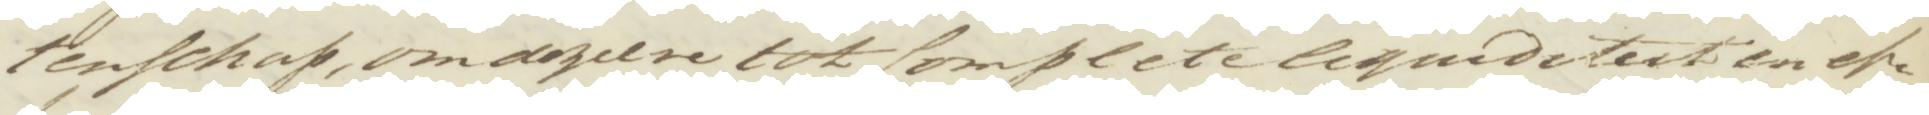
tenschap, om dezelve tot Complete liquiditeit en ef,,
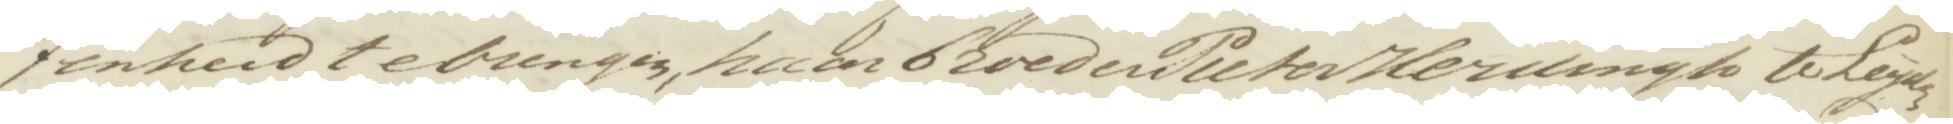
fenheid te brengen, haar broeder Pieter Herdingh te Leijden
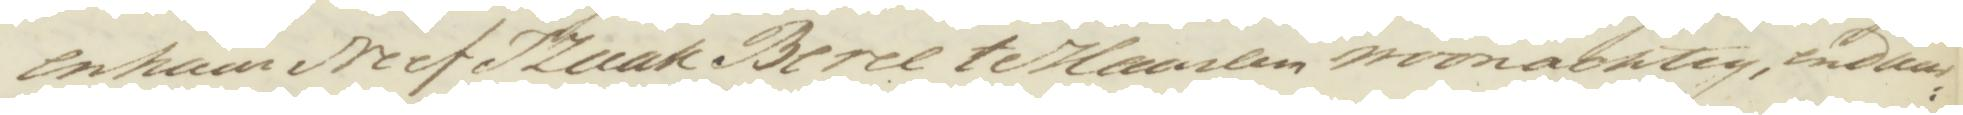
En haar Neef Izaak Bevel te Haarlem woonachtig, en daar
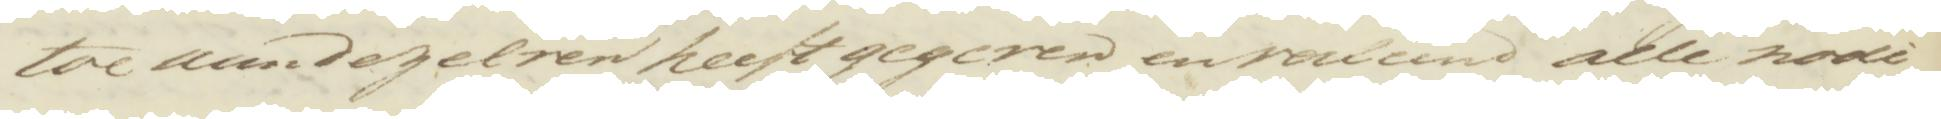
toe aan dezelven heeft gegeven en verleend alle nodi
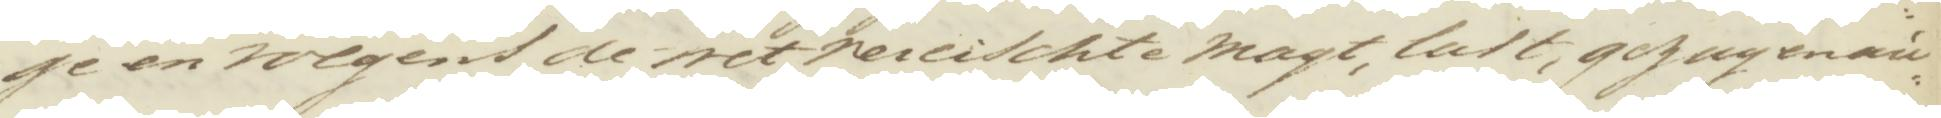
ge en volgens de wet vereischte magt, last, gezag en au„
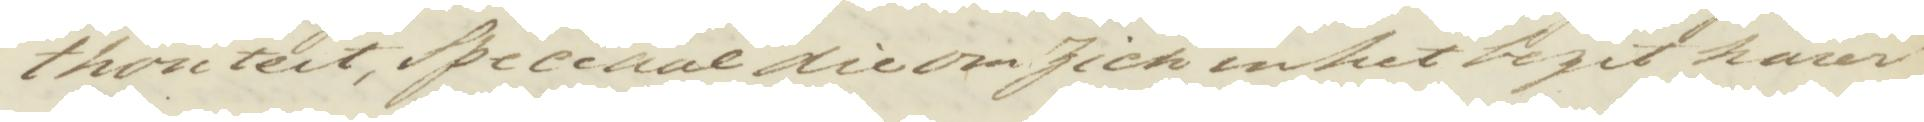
thoriteit, Speciaal die om Zich in het bezit harer
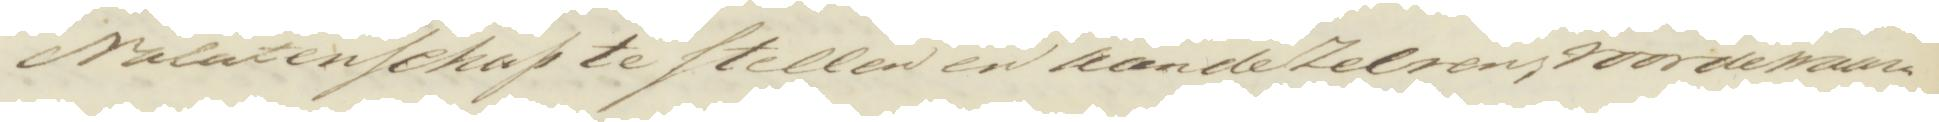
Nalatenschap te Stellen en aan de Zelven, voor de waar
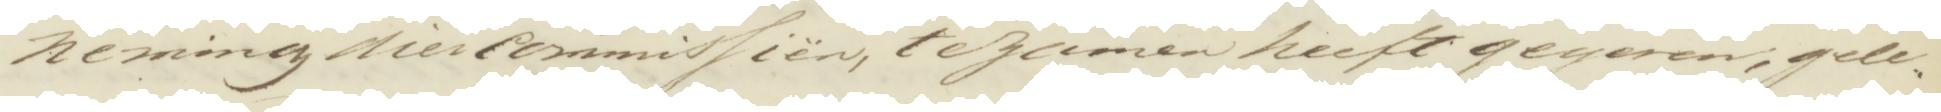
neming dier commissiën, tezamen heeft gegeven, gele„
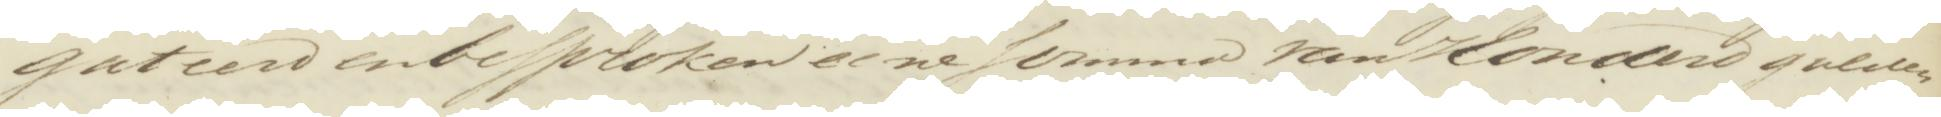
gateerd en besproken eene Somma van Honderd gulden
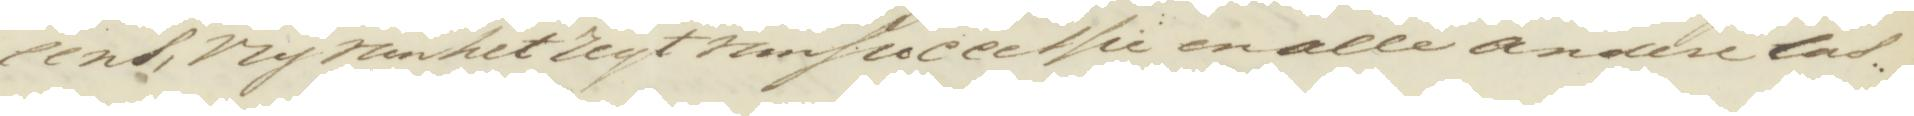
eens, vry van het regt van successie en alle andere las„
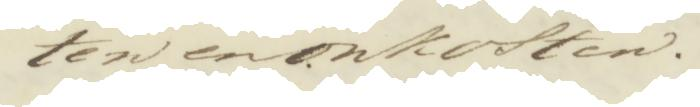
ten en onkosten.
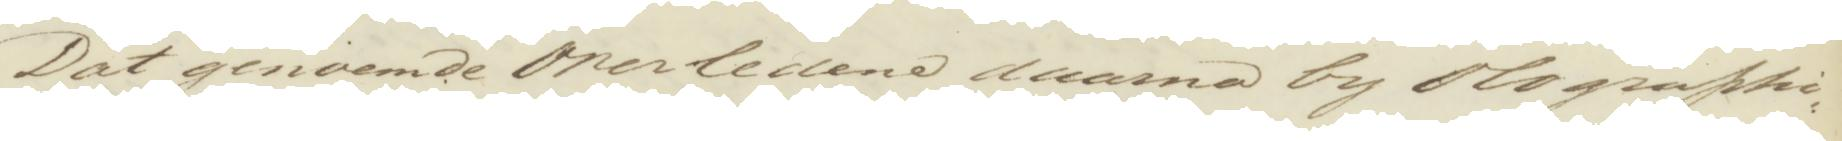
Dat genoemde overledene daarna by Olographi„
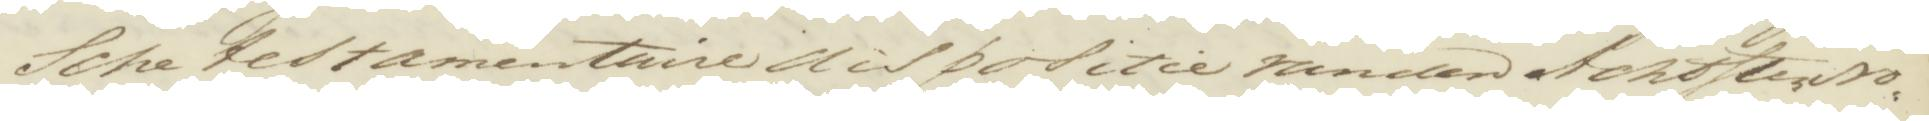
sche testamentaire dispositie van den Achtsten No.
